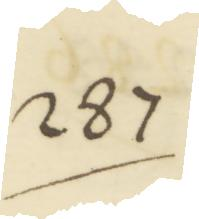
287
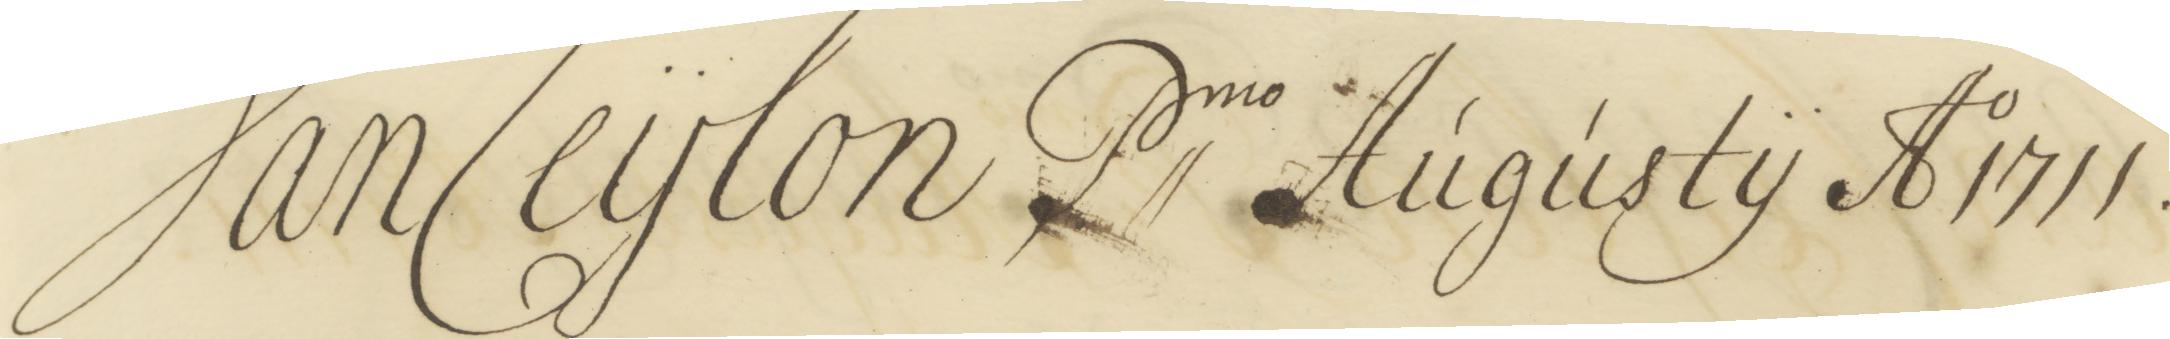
Van Ceijlon P„mo Augustij Ao 1711.
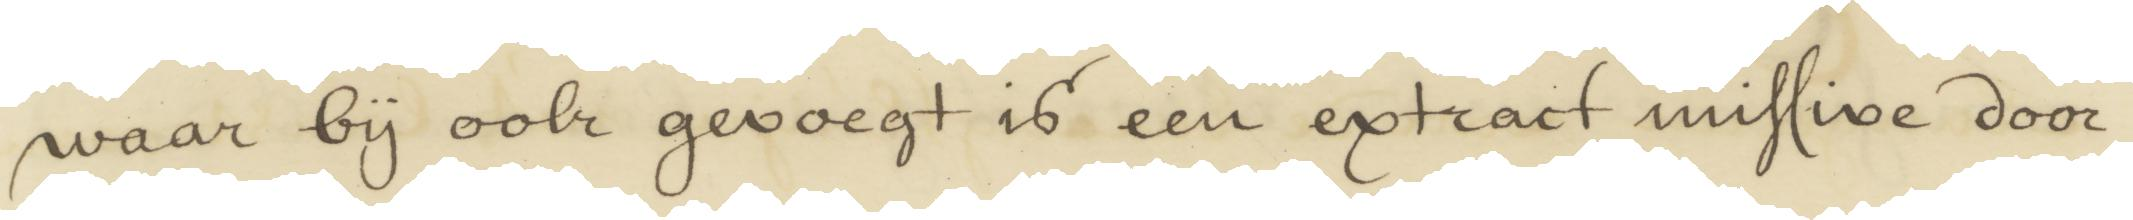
waar bij ook gevoegt is een extract missive door
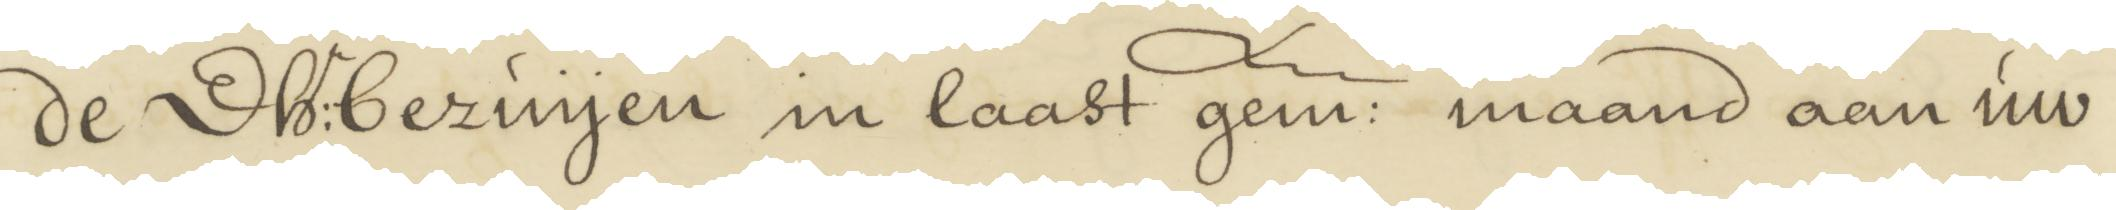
de Eh:r bezuijen in laast gem: maand aan uw
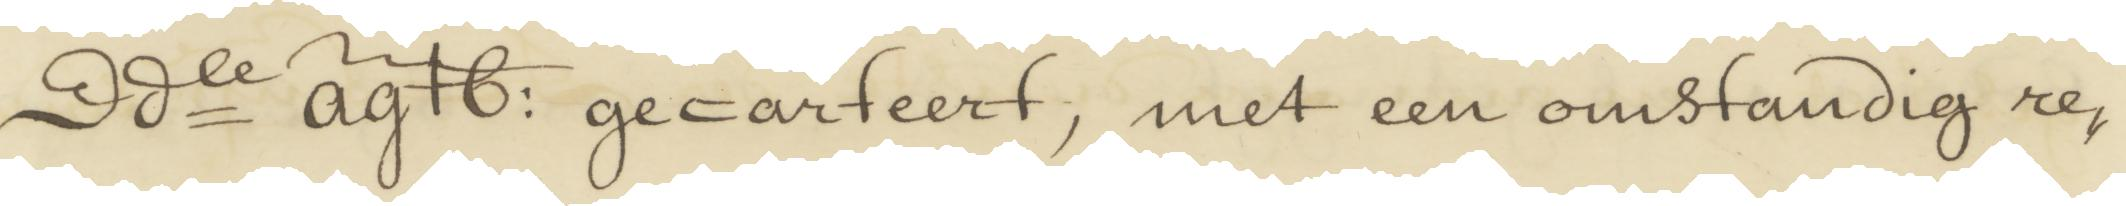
Ed=le agtb: gecarteert, met een omstandig re„
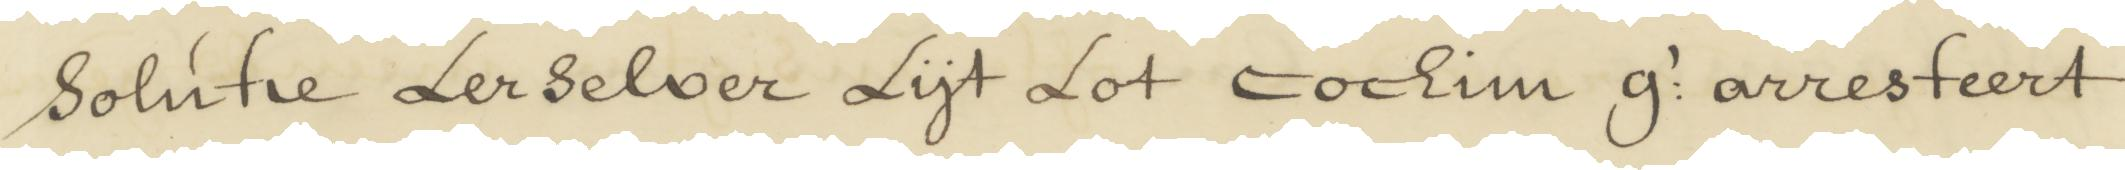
solutie ter selver tijt tot cochim g': arresteert
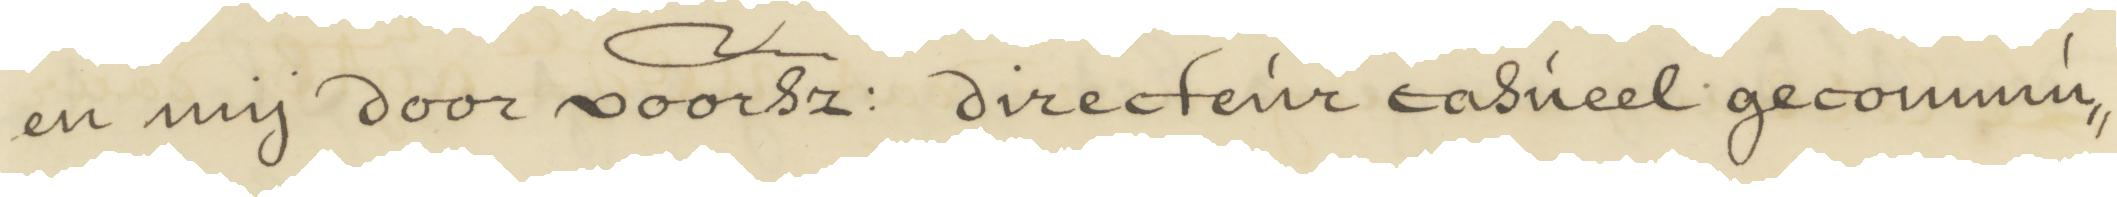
en mij door voorsz: directeur casueel gecommu„
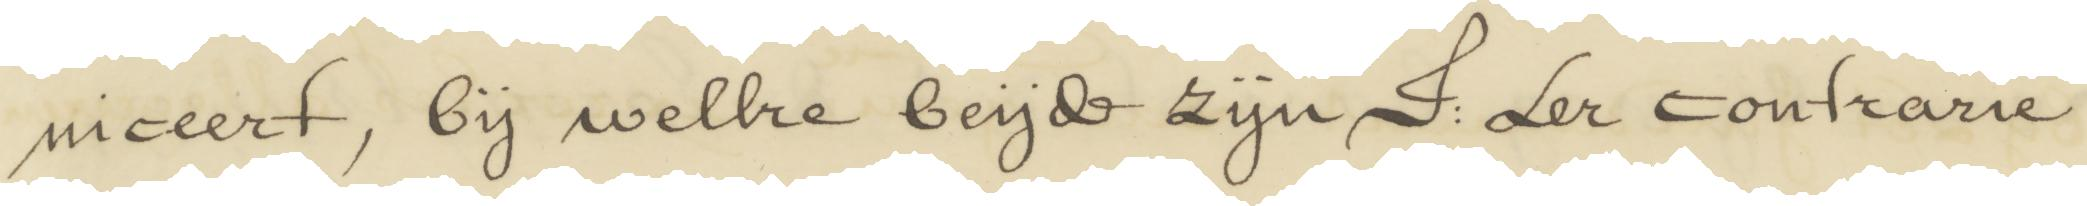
niceert, bij welke beijde zijn E: ter contrarie
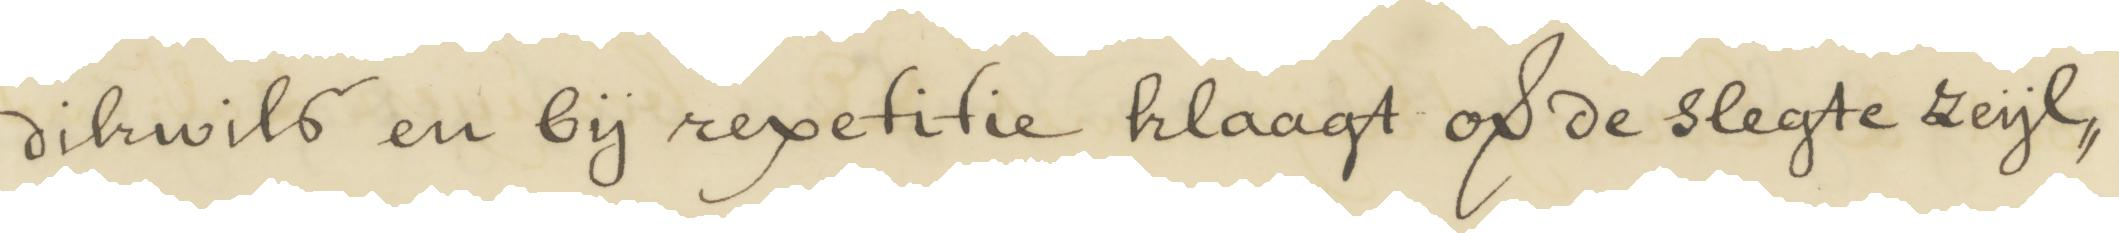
dikwils en bij repetitie klaagt over de slegte zeijl„
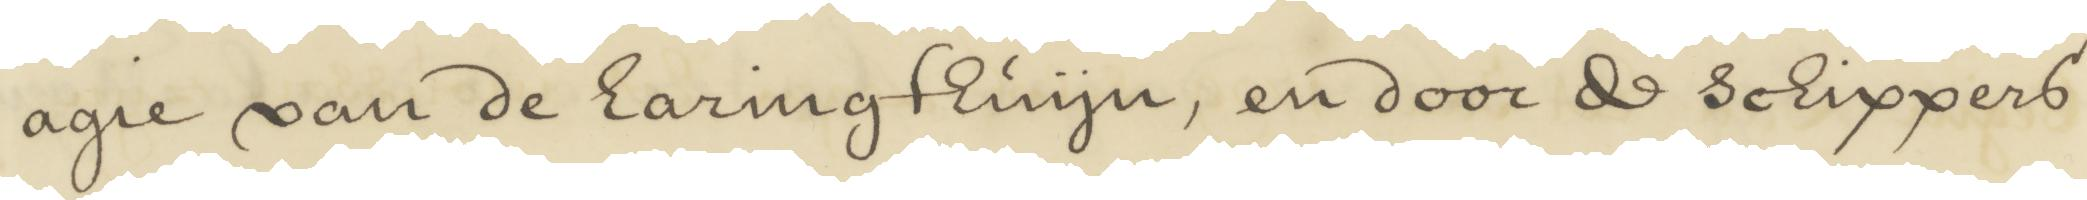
agie van de haringthuijn, en door de schippers
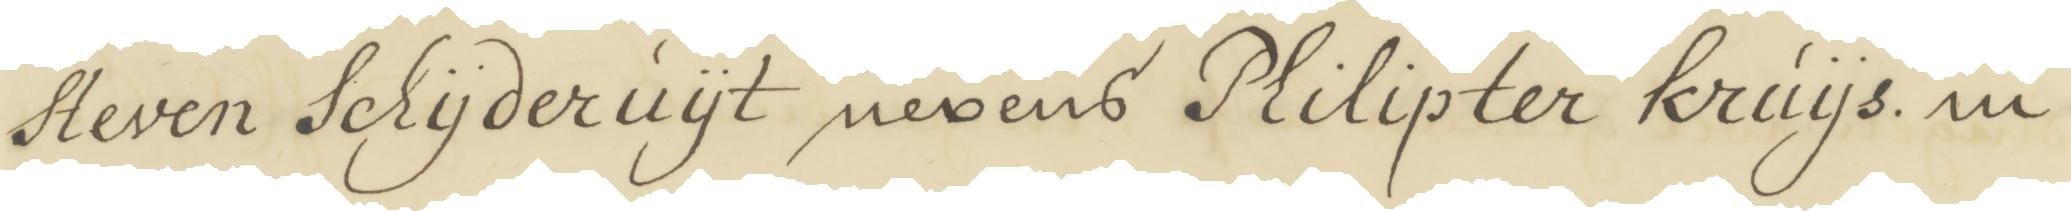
steven schijderuijt nevens Philip ter kruijs. in
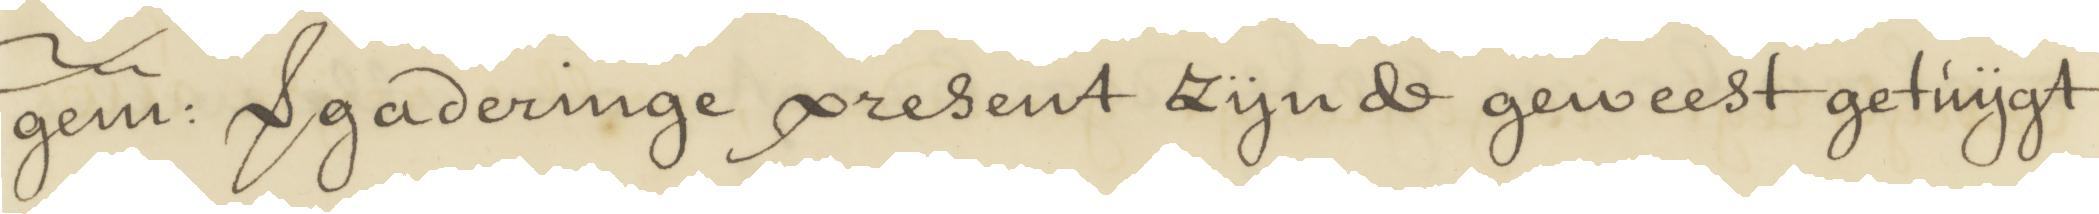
gem: vergaderinge present zijn de geweest getuijgt
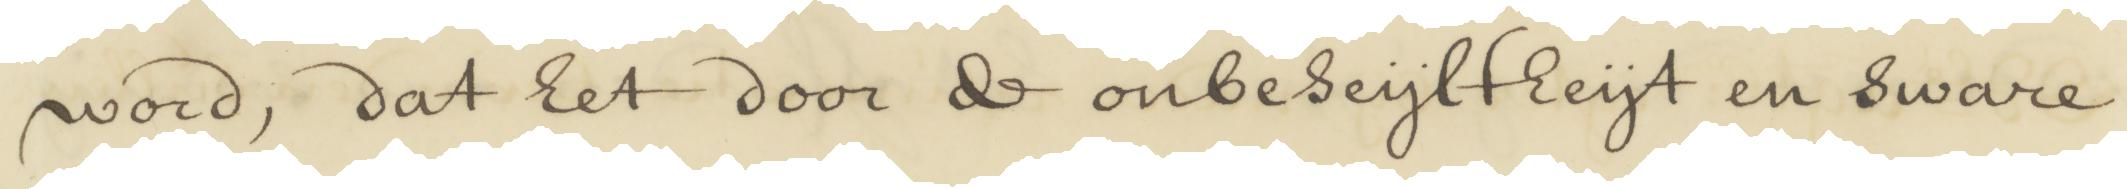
word, dat het door de onbeseijltheijt en sware
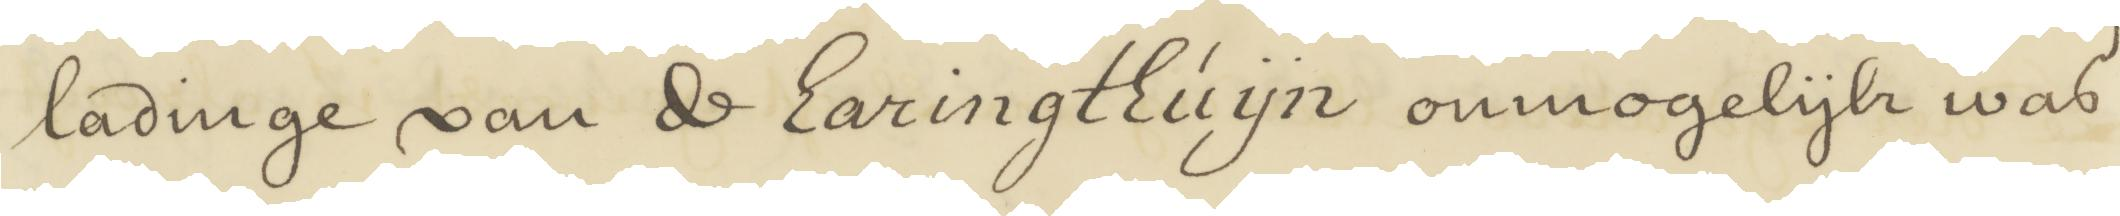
ladinge van de haringthuijn onmogelijk was
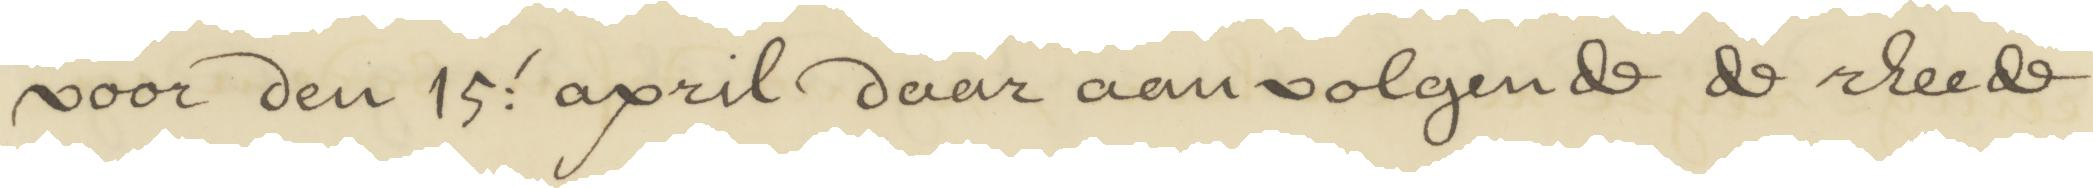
voor den 15:' april daar aan volgende de rheede
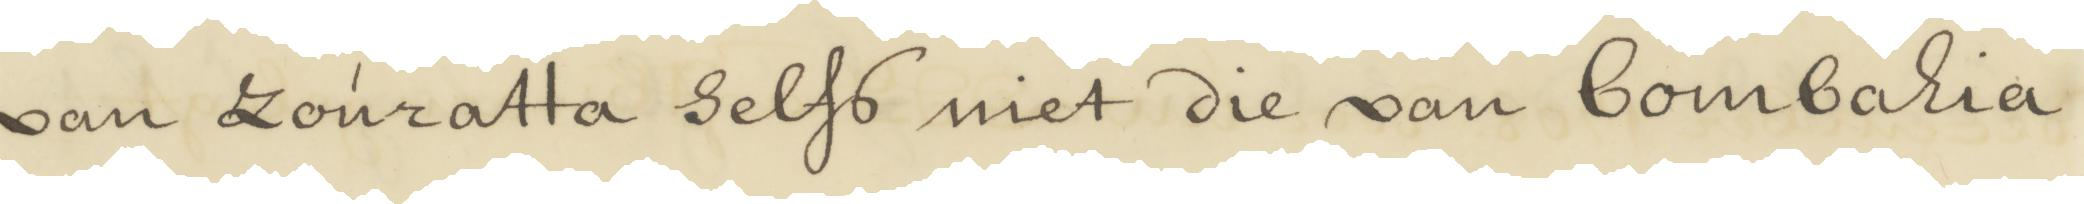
van zouratta selfs niet die van bombahia
